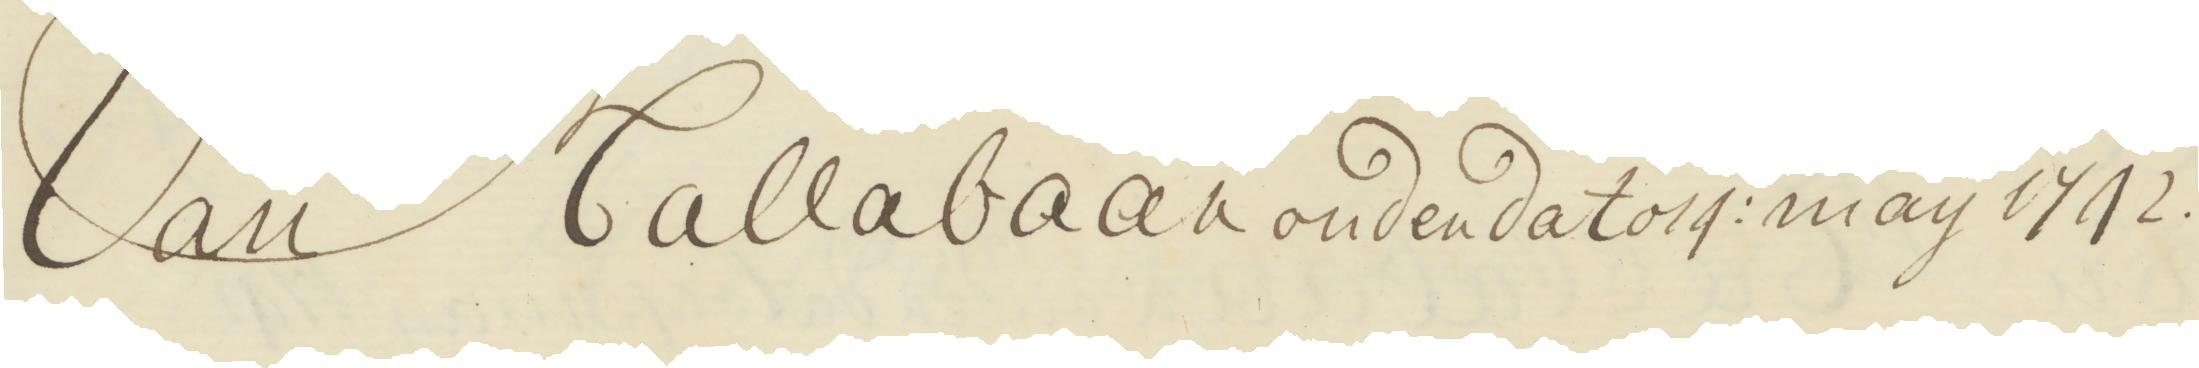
Van Mallabaar onder dato14:' maij 1742.
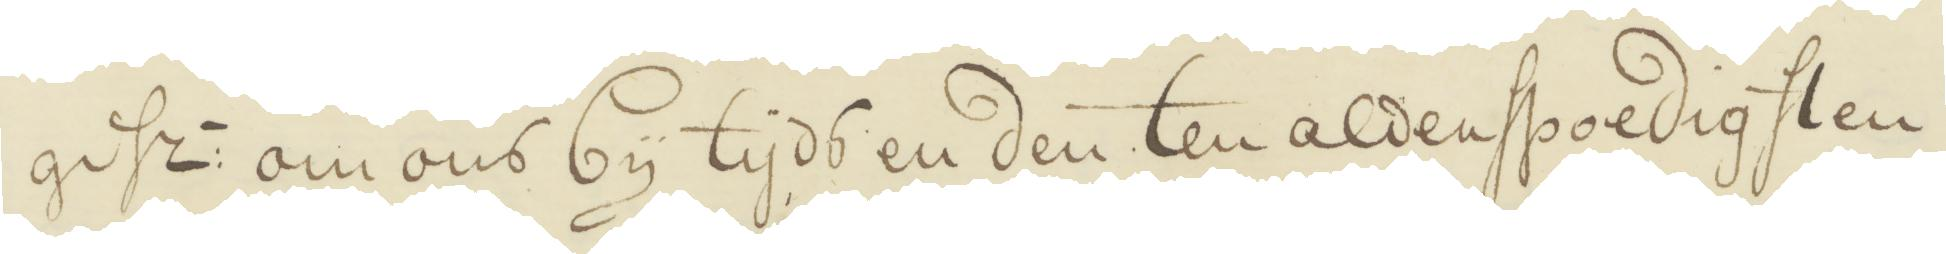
gesz: om ons bij tijds en den ten alderspoedigsten
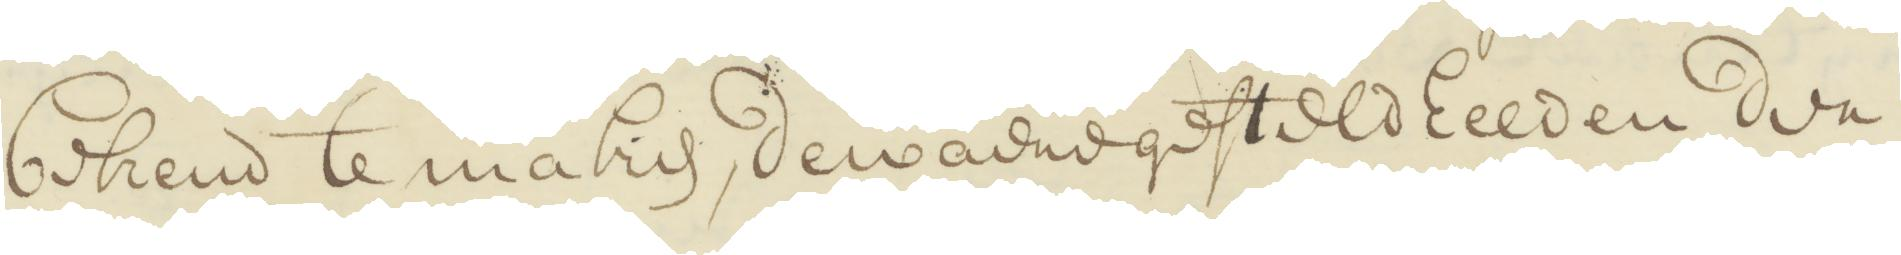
bekend te maken, dewaere gesteldheeden der
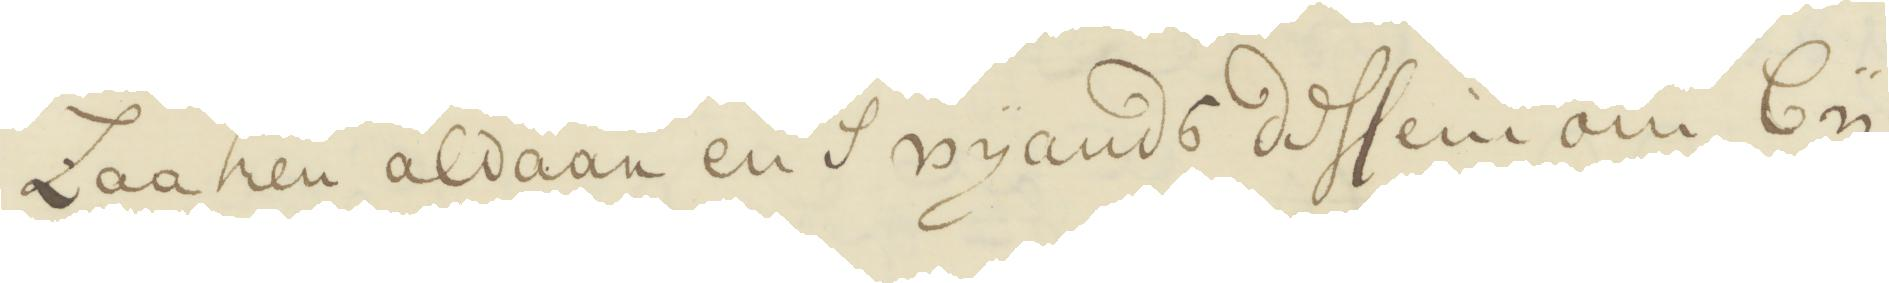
zaaken aldaar en 's vijands dessein om bij
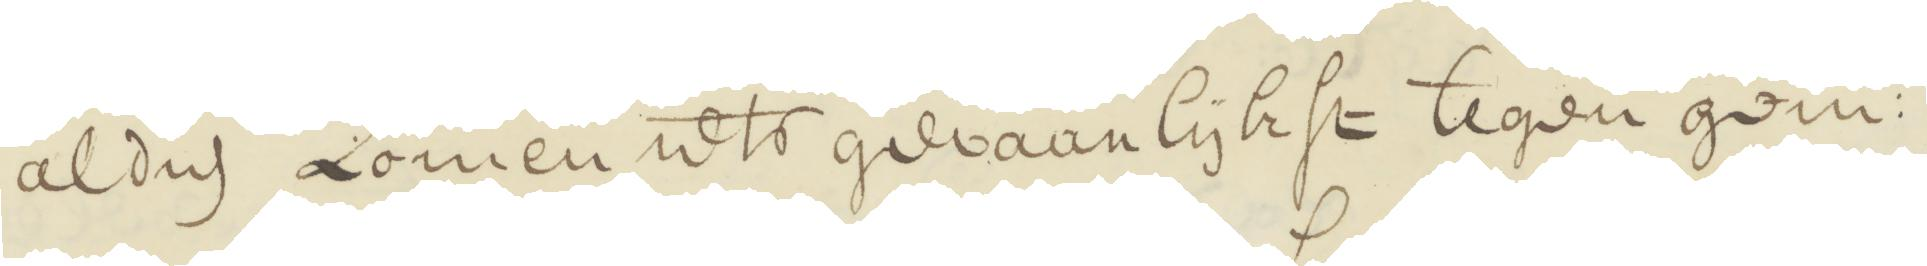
aldien zo men iets gevaarlijkst tegen gem:
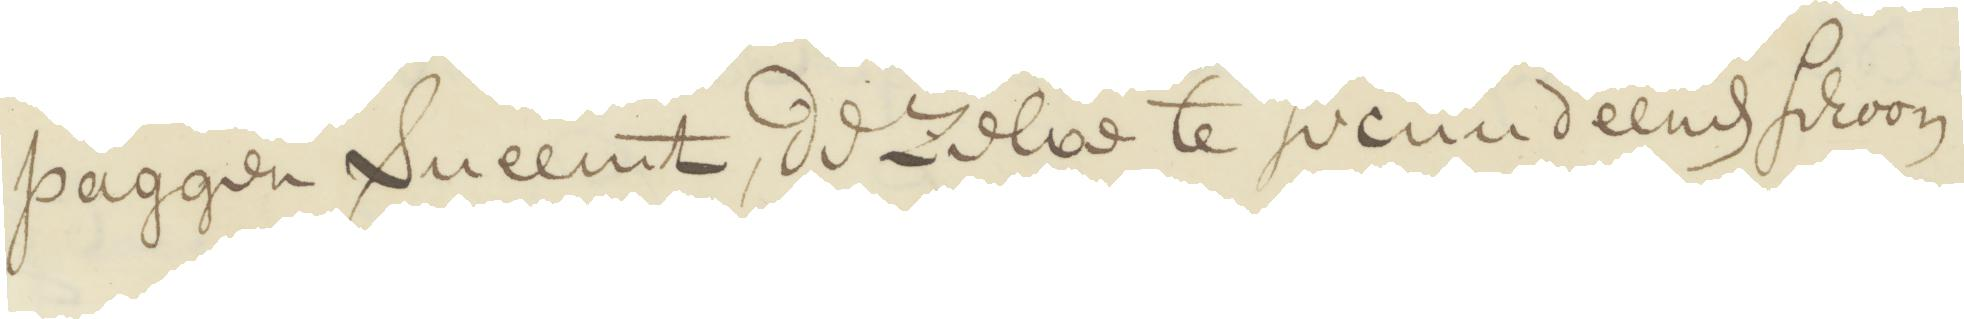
pagger verneemt, dezelve te secundeeren schoon
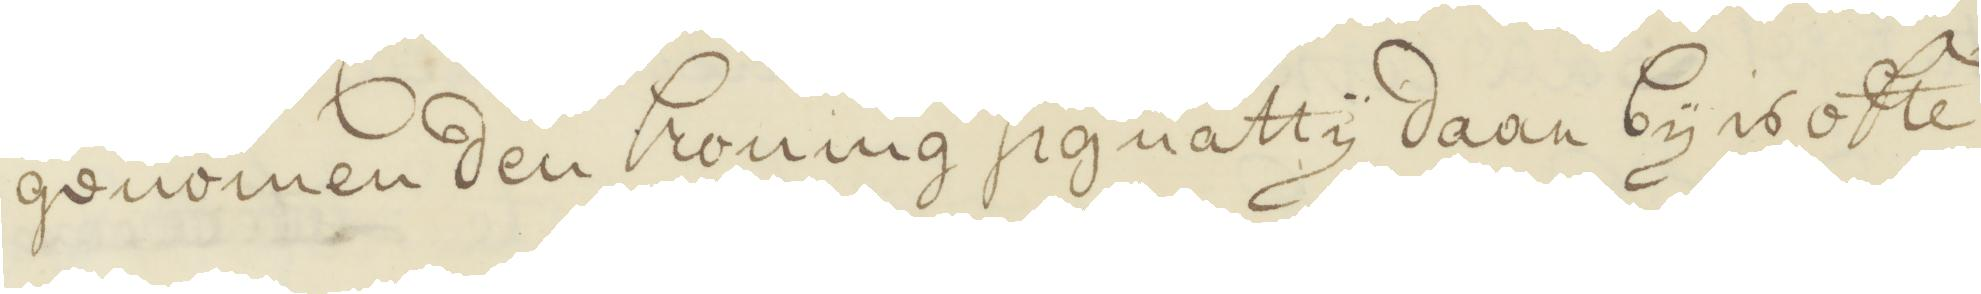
genomen den koning signattij daar bij is ofte
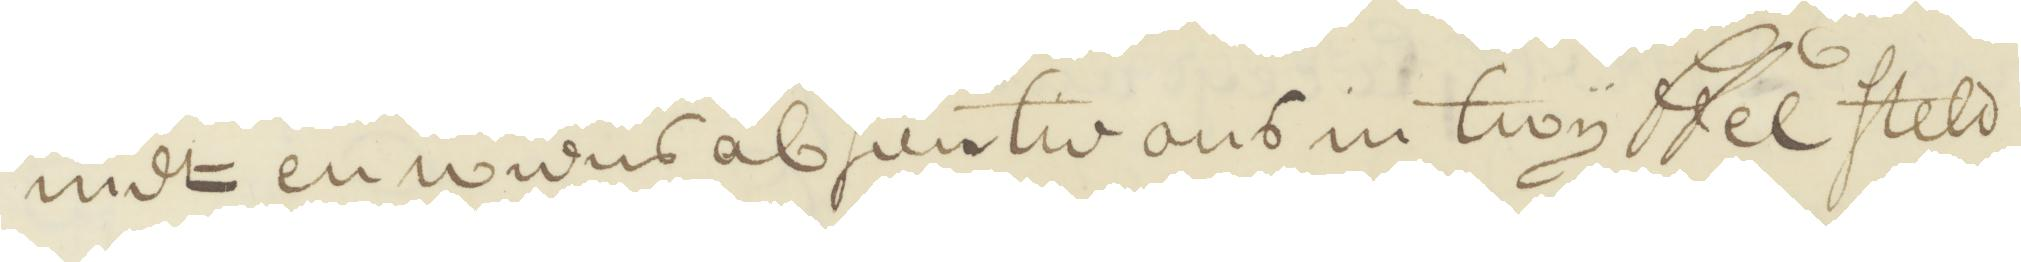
niet en wiens absentie ons in twijffel steld
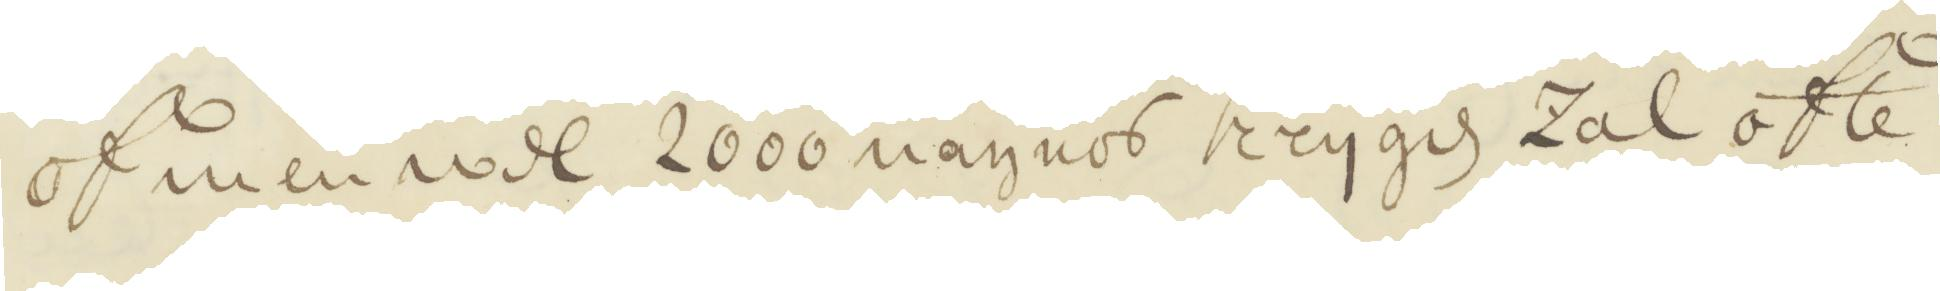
of men wel 2000 naijros krijgen zal ofte
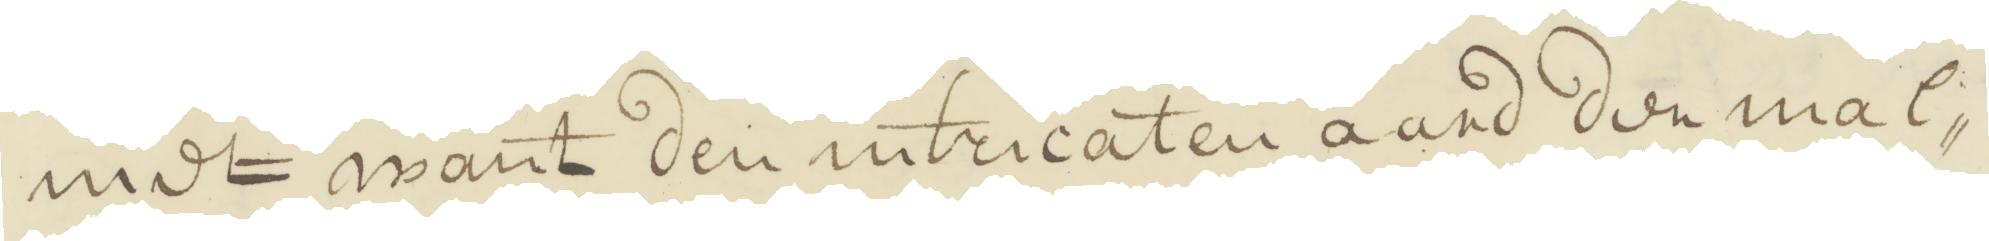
niet want den intricaten aard der mal„
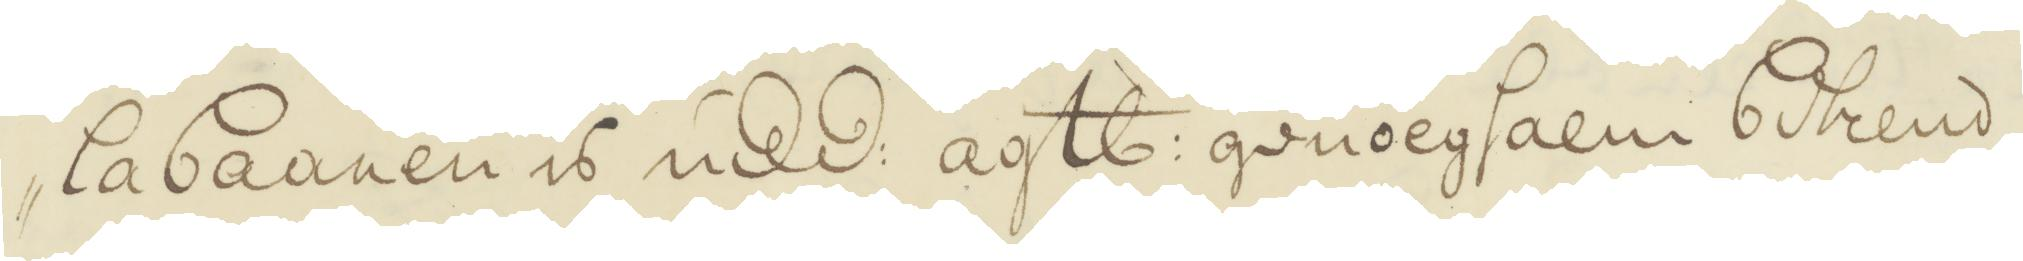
„labaaren is uEE: agtb: genoegsaem bekend
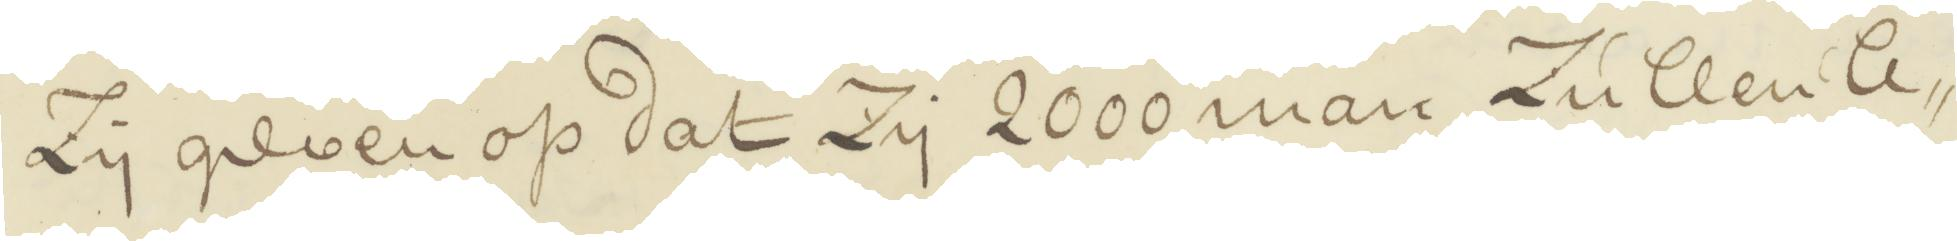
zij geven op dat zij 2000 man zullen le„
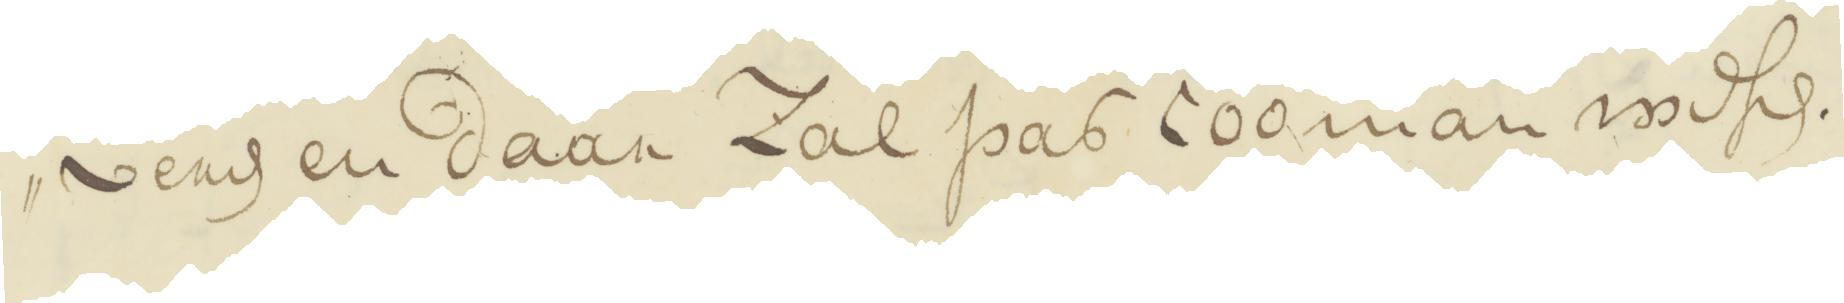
„veren en daar zal pas 500 man wesen.
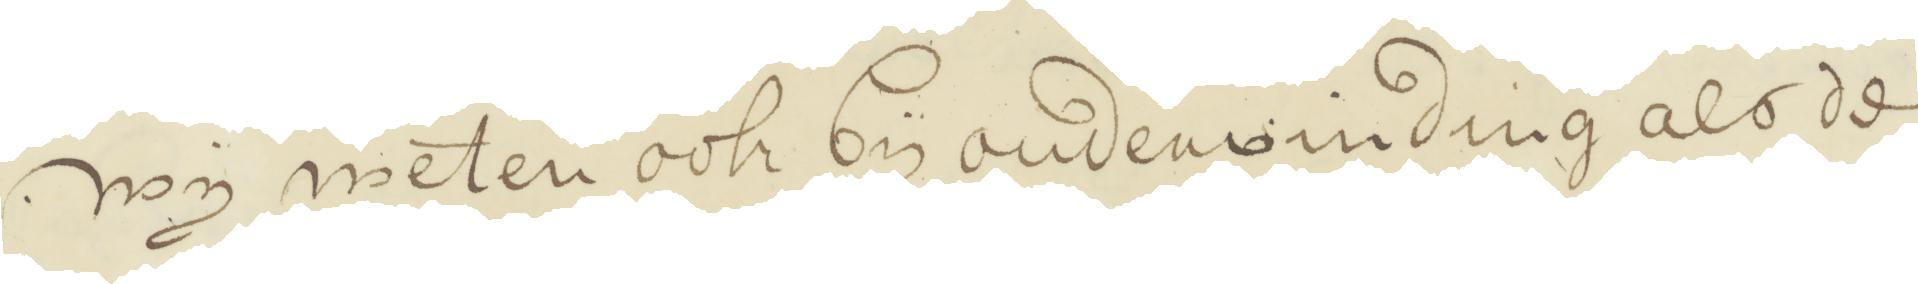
wij weten ook bij ondervinding als de
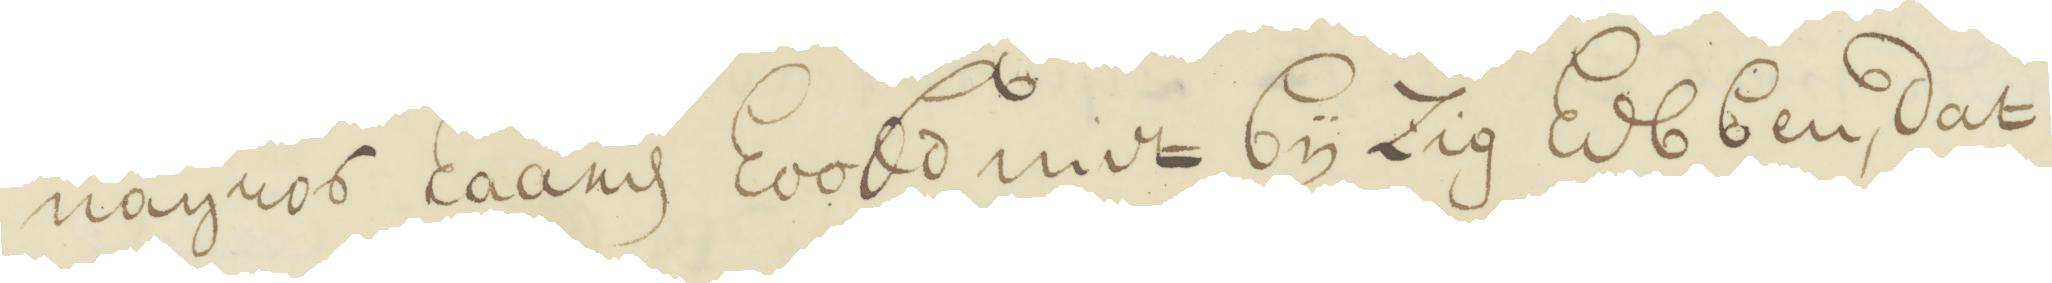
naijros haaren hoofd niet bij zig hebben, dat
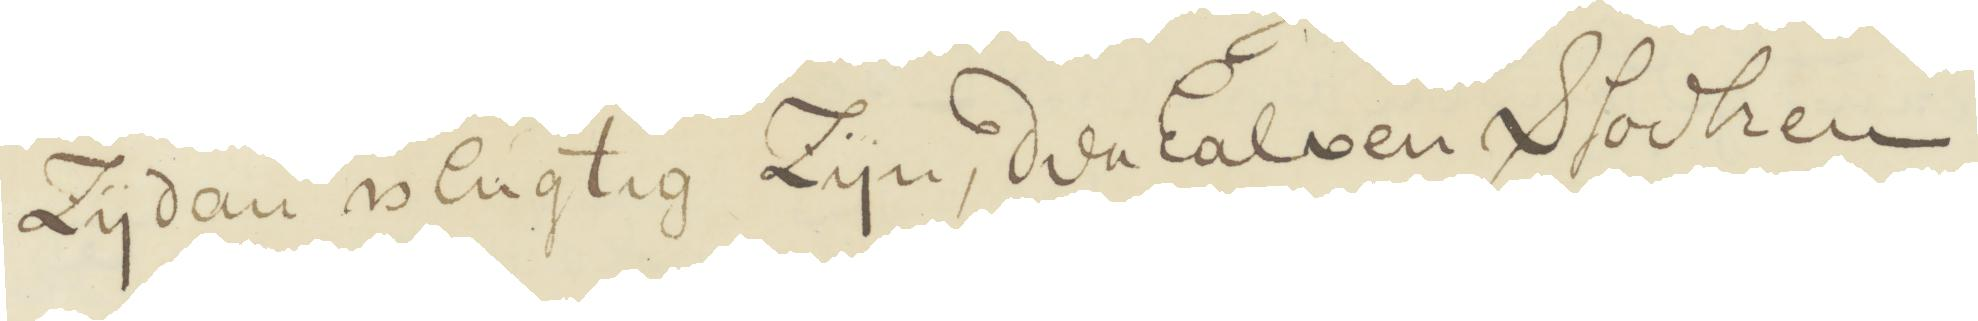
zij dan vlugtig zijn, der halven versoeken
